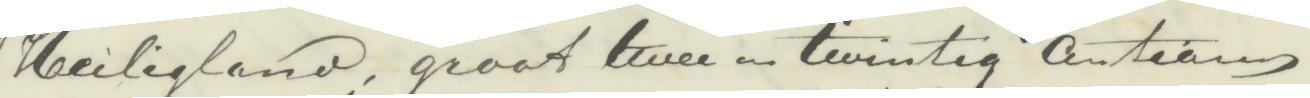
Heiligland, groot twee en twintig centiaren
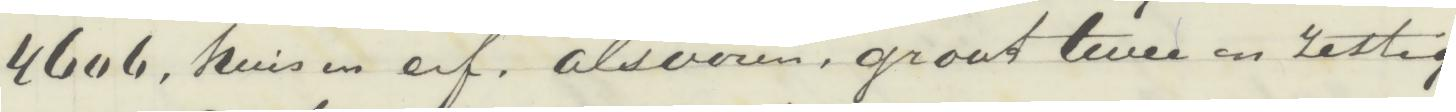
4606, huis en erf, alsvoren, groot twee en zestig
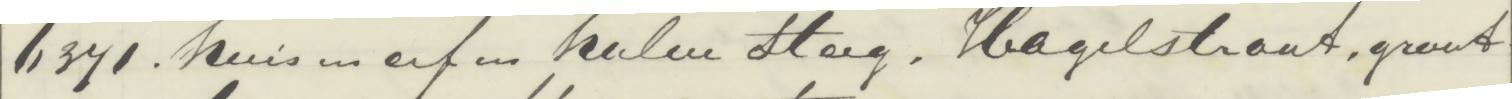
6371. huis en erf en halve steeg, Hagelstraat, groot
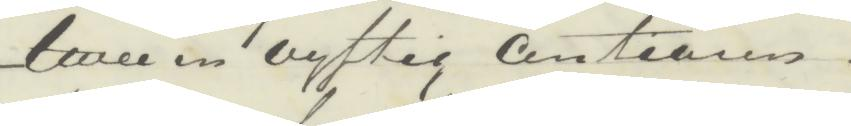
twee en vyftig centiaren
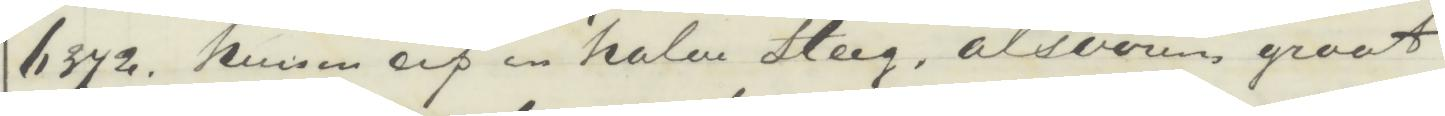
6372. huisen oep en halve steeg, alsvoren groot
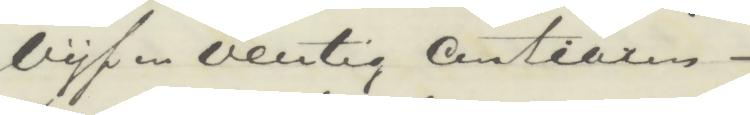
vijf en veertig centiaren -
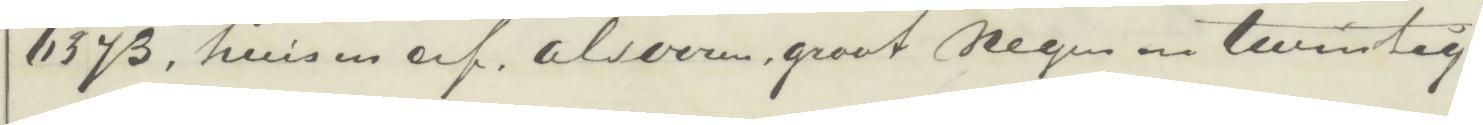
6373, huis en erf, alsvoren, groot negen en twintig
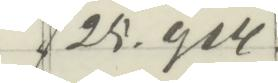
ƒ25. 914
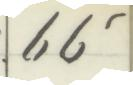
66 5
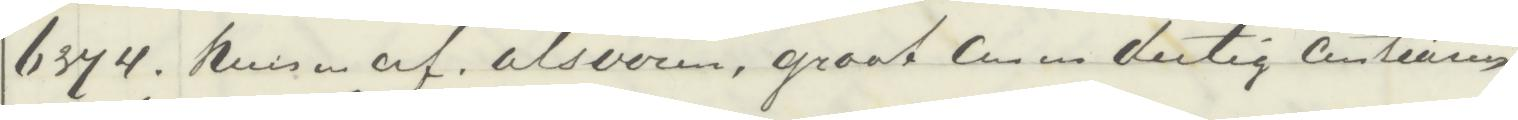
6374. huis en erf, alsvoren, groot een en dertig centiaren
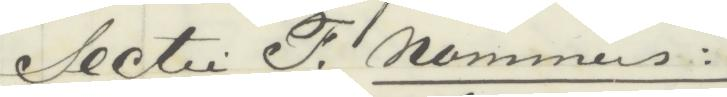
sectie F. Nommers:
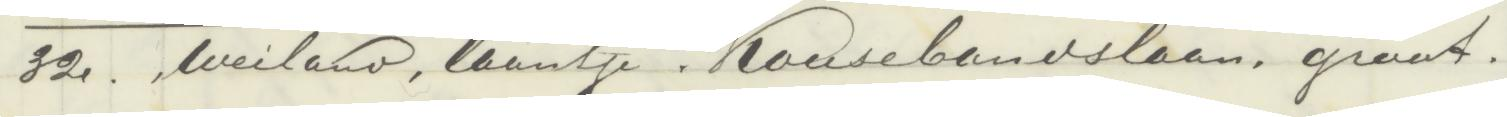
32., weiland, laantje, Kousebandslaan, groot.
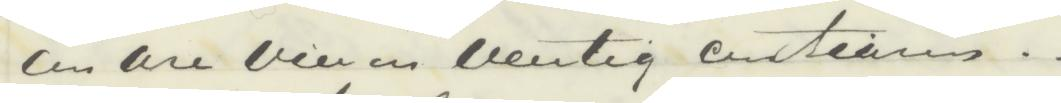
een are vier en veertig centiaren.
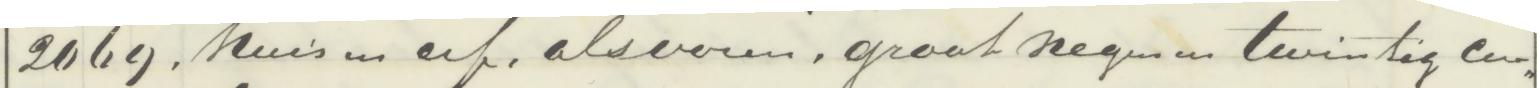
2069, huis en erf, alsvoren, groot negen en twintig cen„
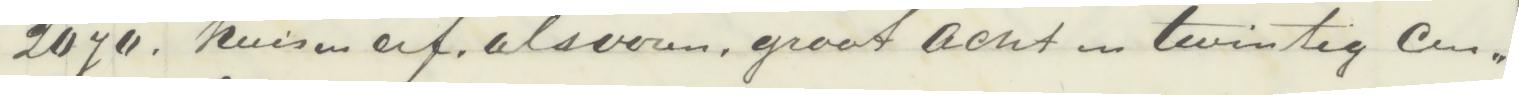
2070, huis en erf, alsvoren, groot acht en twintig cen„
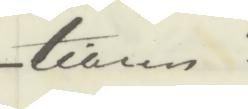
„tiaren
